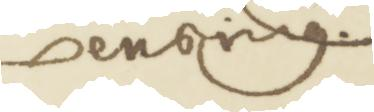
versing.
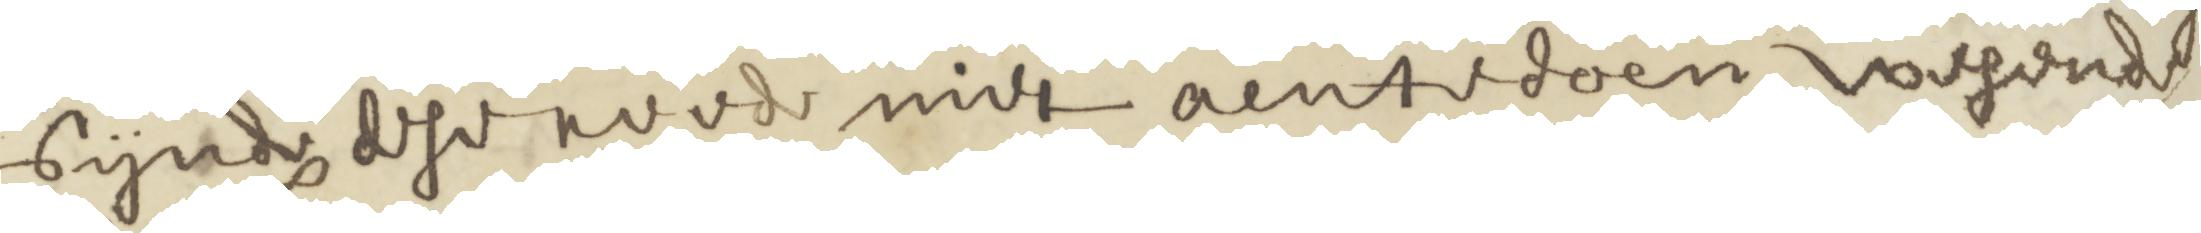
sijnde dese reede niet aente doen wesende
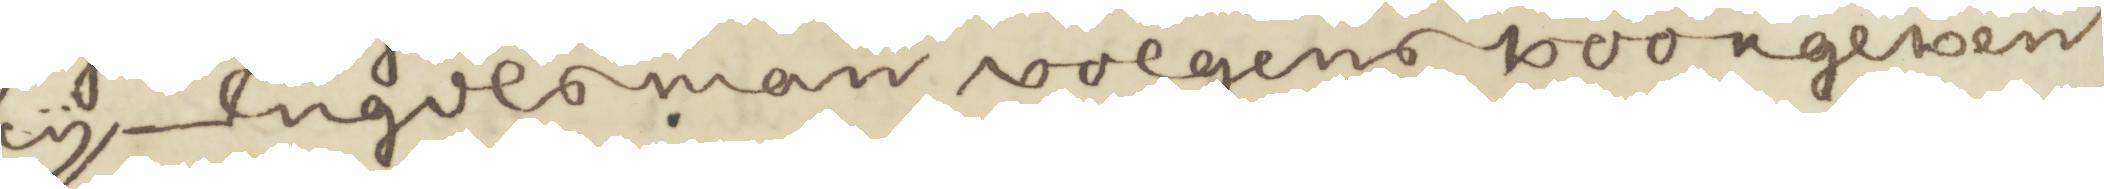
hij Engelsman volgens voorgeven
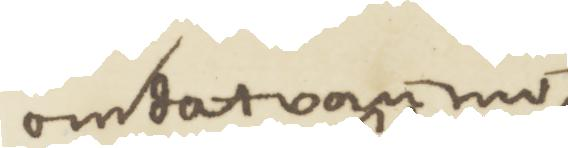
om dat van me„
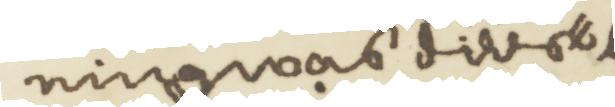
ning was dees
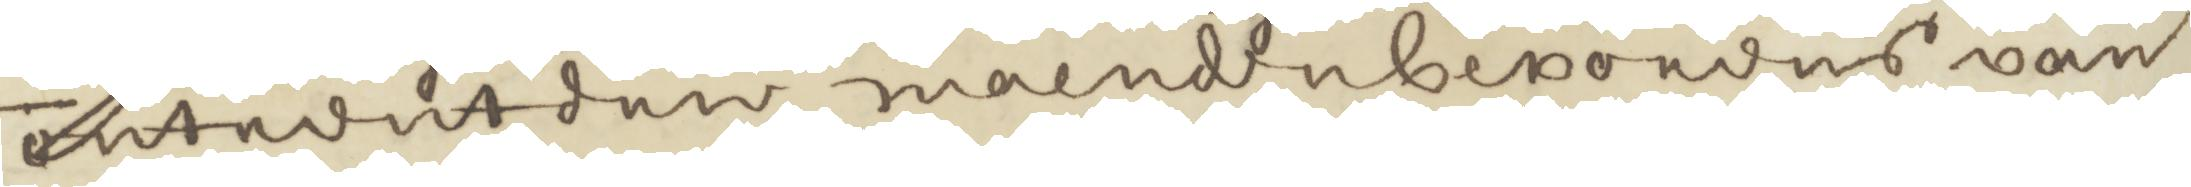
ontrent drie maenden bevorens van
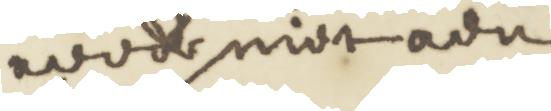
reede niet aen
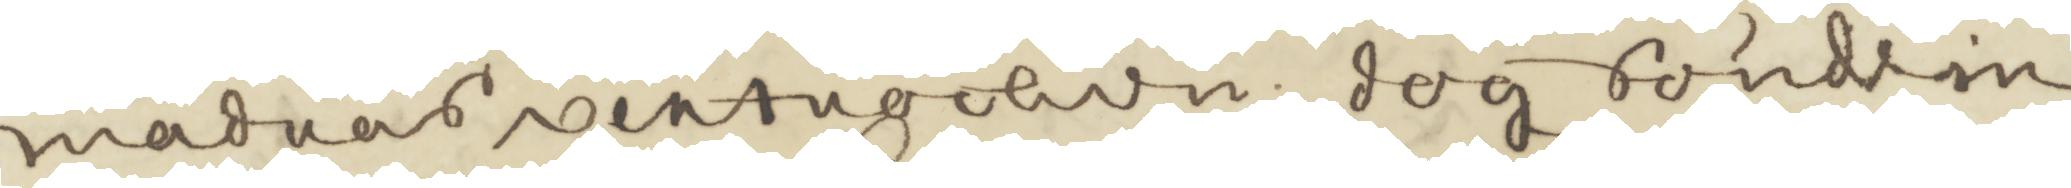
madras vertrocken; dog soude in
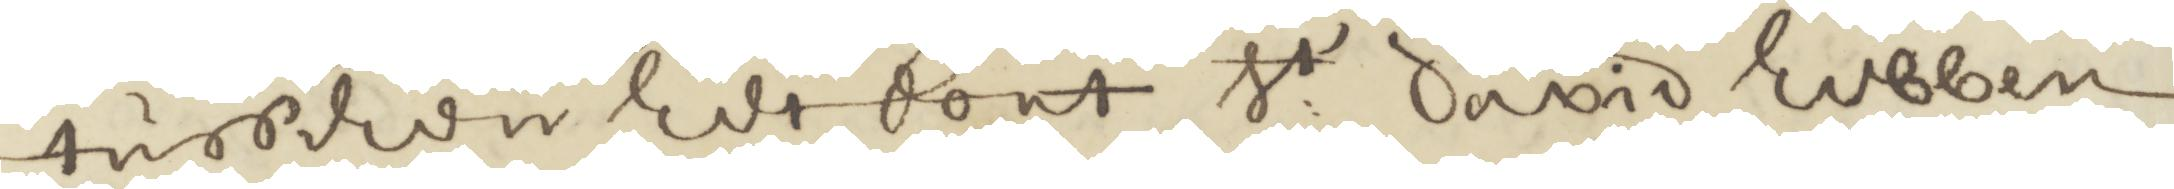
tusschen het fort s:t david hebben
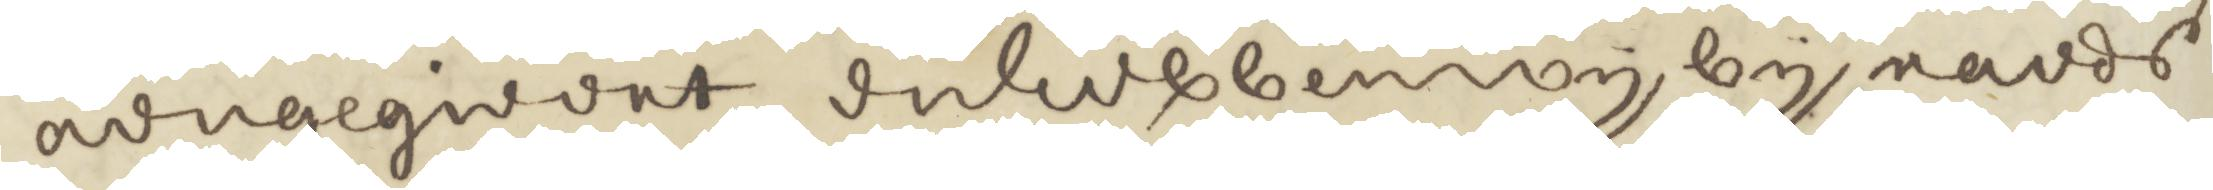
aengegieert en hebben wij bij raeds
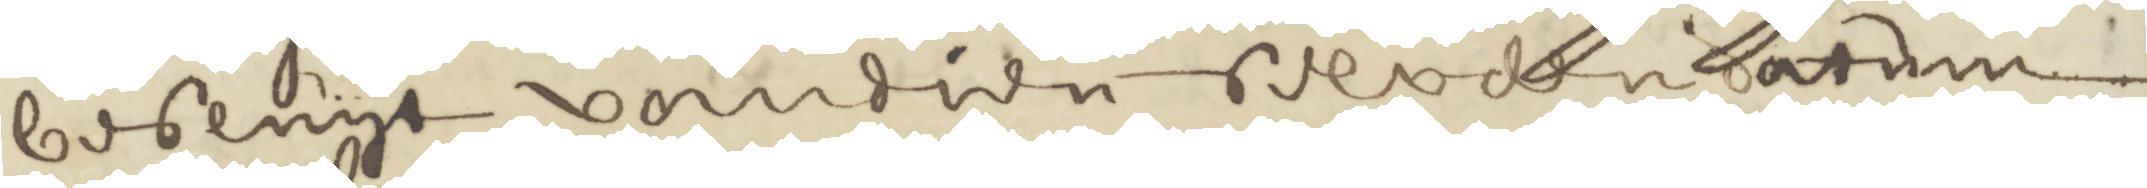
besluijt vandien selvden datum
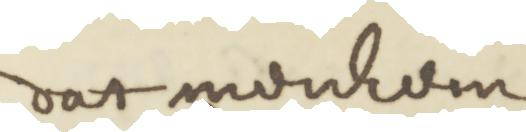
dat men hem
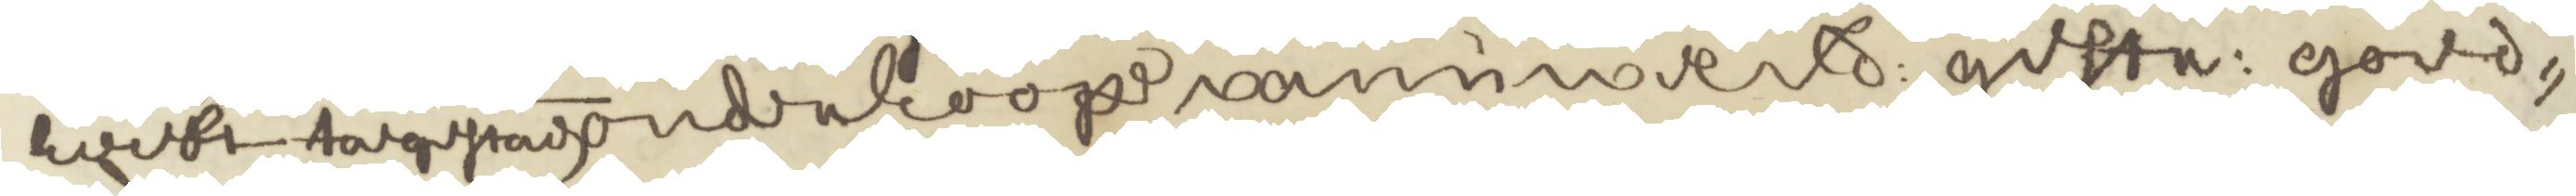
heeft toegestaen onder hoope van uwelEd: gestr: goed„
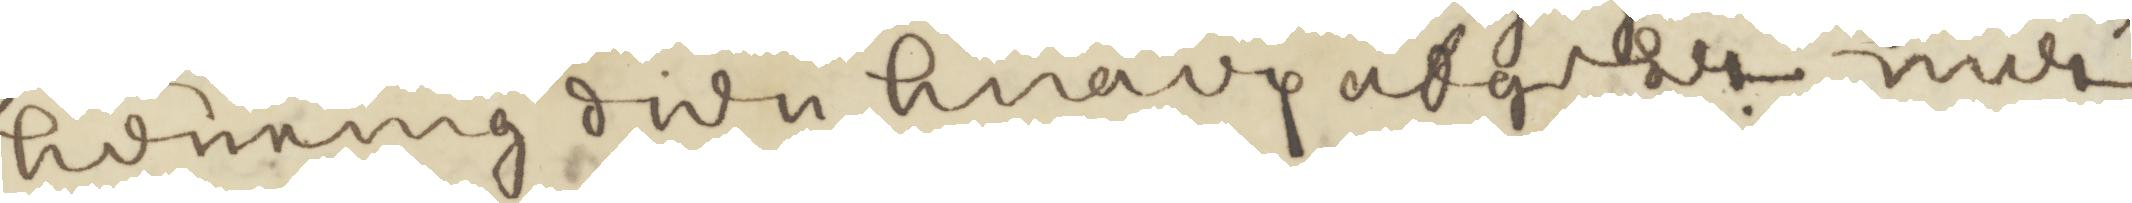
keuring dien knaep afgeset met
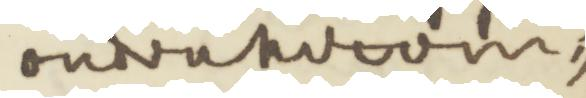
onder recom„
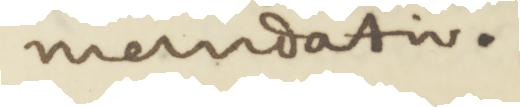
mendatie.
